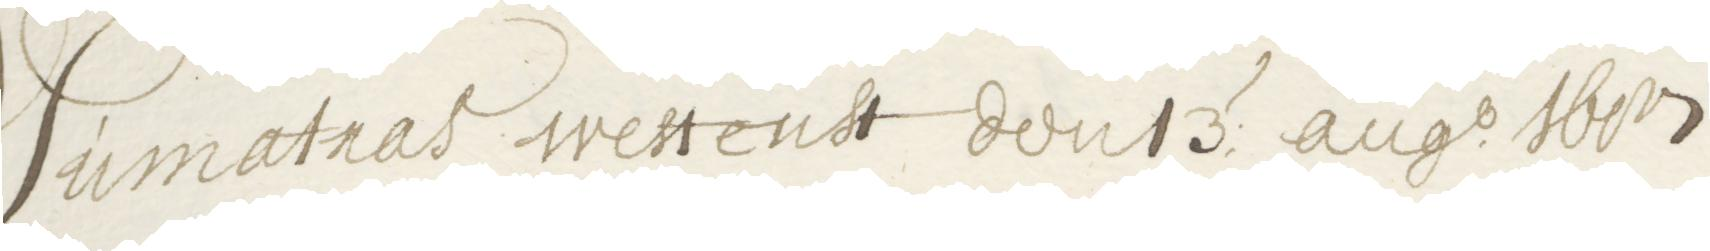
Sumatras westcust den 13:' aug:s 1687
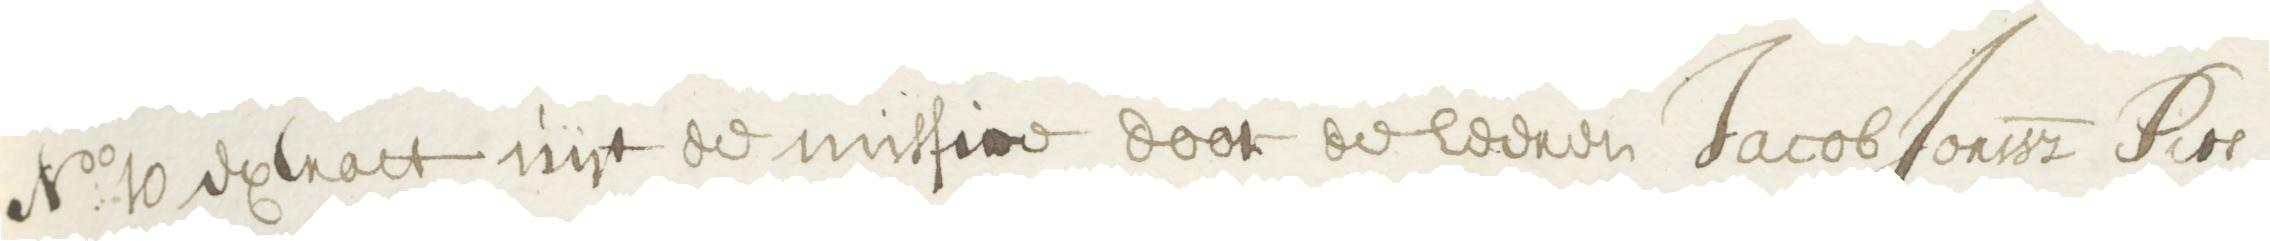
N:o 10 extract uijt de missive door de heeren Jacob Jorisz Pits
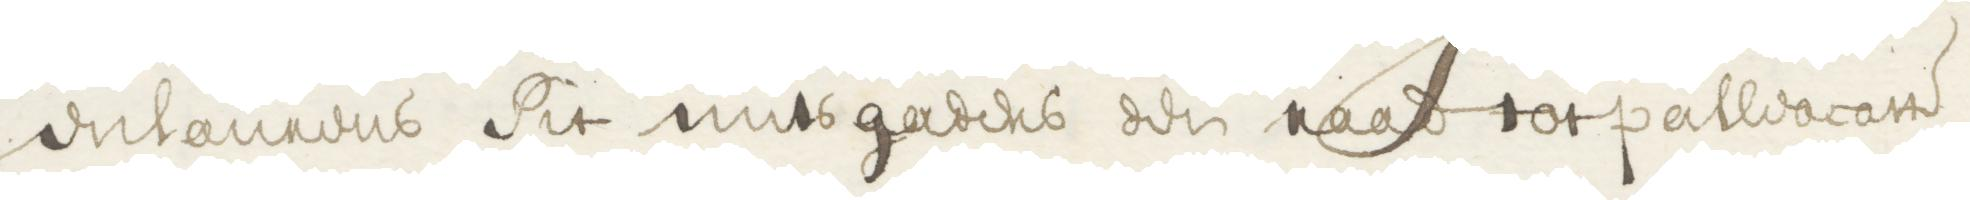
en laurens Pit mitsgaders den raad tot palleacatte
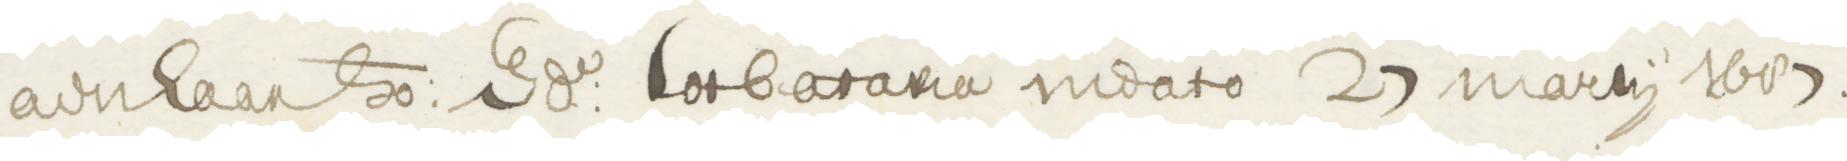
aen haar ho: Ed:e tot batavia in dato 27 martij 1687
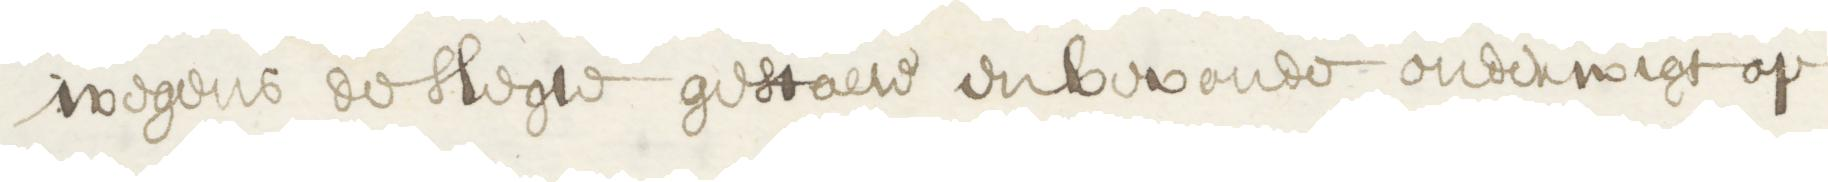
wegens de slegte gestalte en bevonde onderwigt op
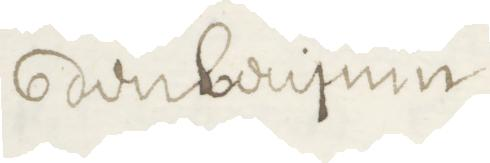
den benjuin
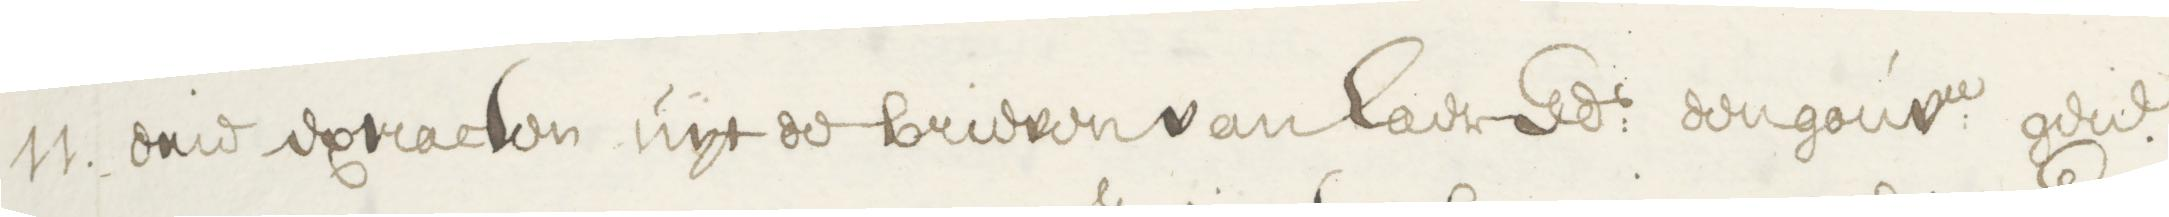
11. drie extracten uijt de brieven van haer Ed:s den gouv:e gene.
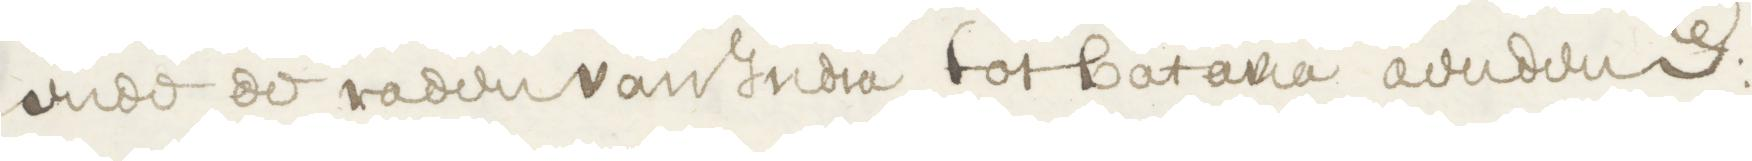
ende de raden van India tot batavia aen den E:
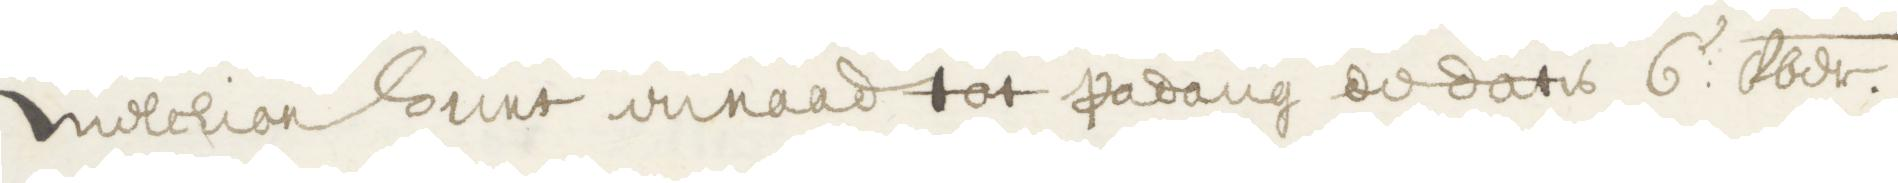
melchior hurt en raad tot padang de datis 6:' 8ber.
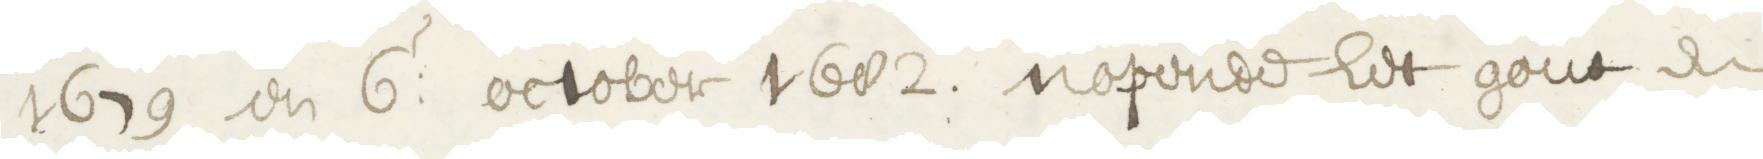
1679 en 6:' october 1682. nopende het gout en
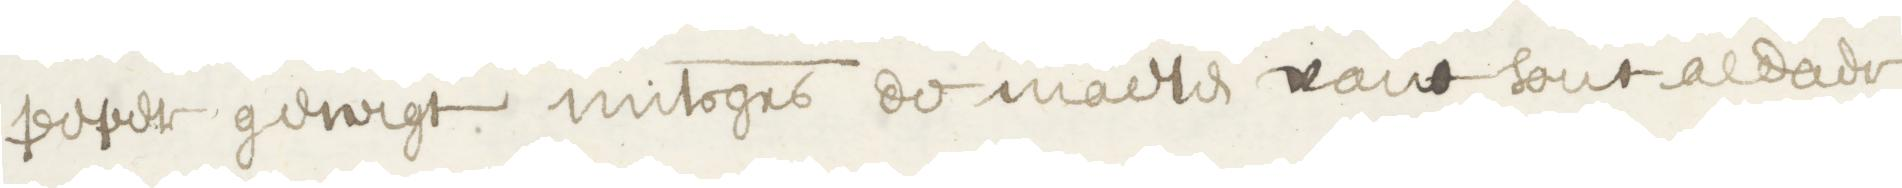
peper gewigt mitsgrs: de maeten van t hout aldaer
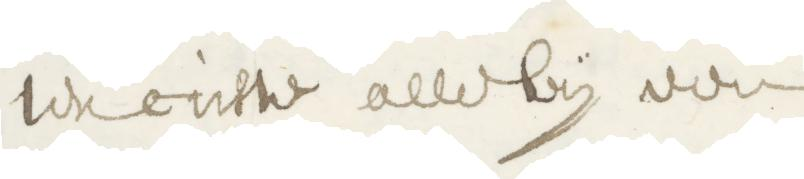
ter custe alle bij een
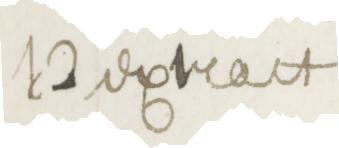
12 extract
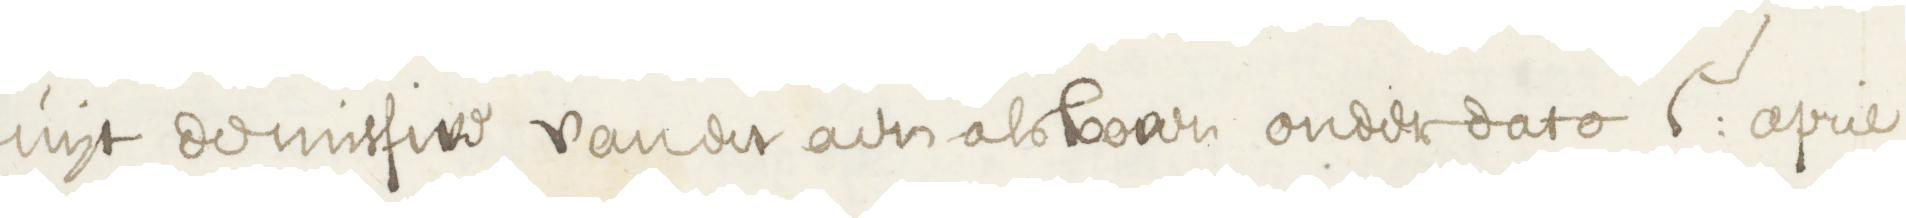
uijt de missive van dit aen als boven onder dato 5:e april
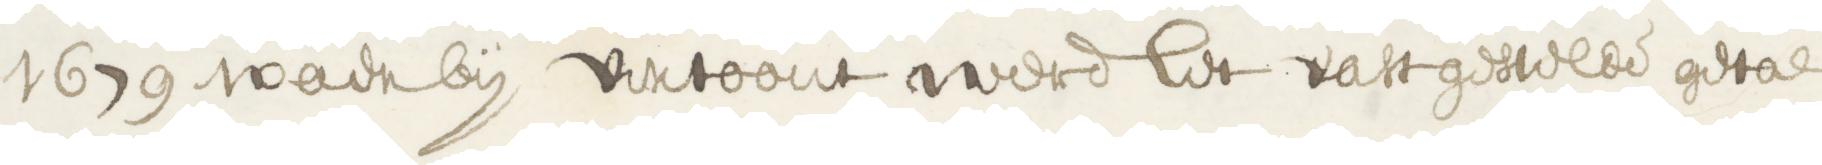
1679 waerbij vertoont werd het vastgestelde getal
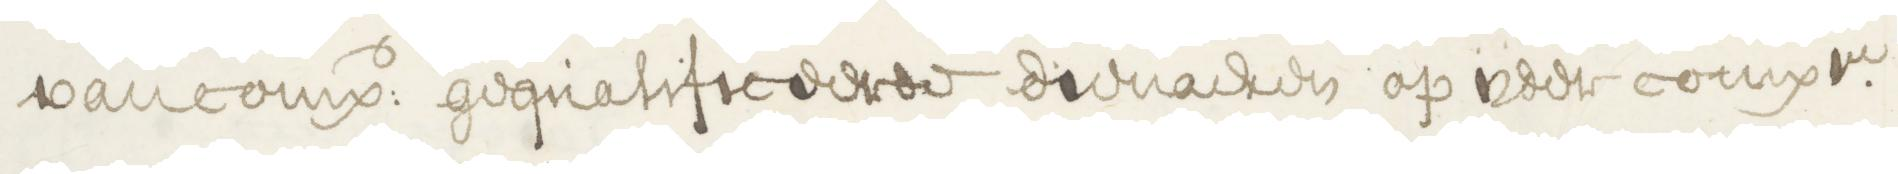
van comp:s gequalificeerde dienaeren op ijder comp:tr
